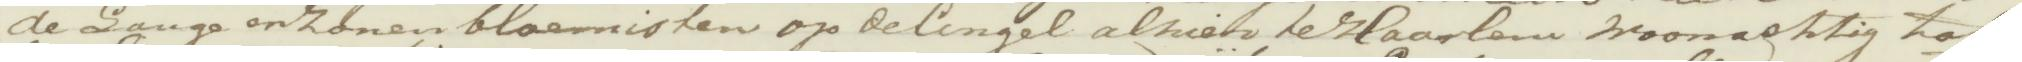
de Lange en Zonen bloemisten op de Cingel alhier te Haarlem woonachtig tot
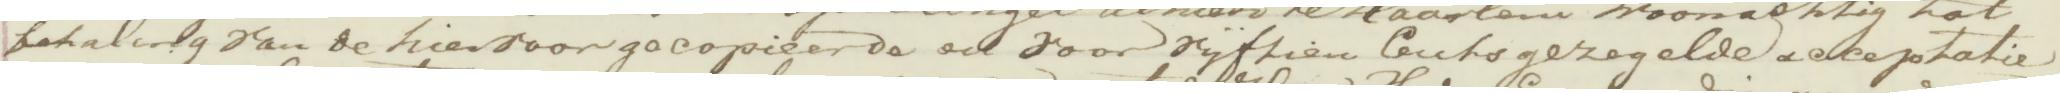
betaling van de hiervoor gecopieerde en voor Vijftien Cents gezegelde acceptatie
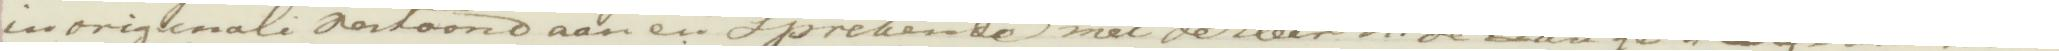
in originali vertoond aan en sprekende met de Heer H. de Lange die geandwoord
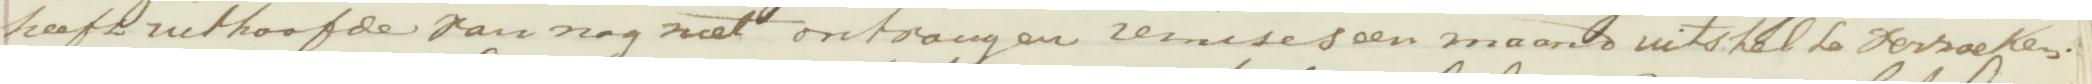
heeft uithoofde van nog niet ontvangen remises een maand uitstel te verzoeken.
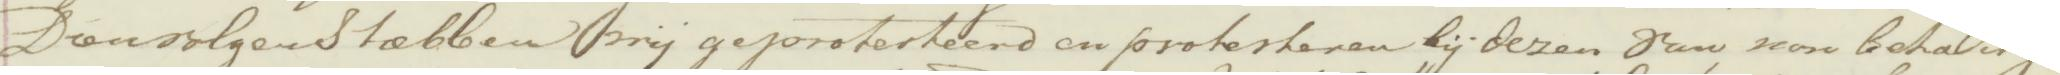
Dienvolgens hebben wij geprotesteerd en protesteren bij dezen Van non betaling
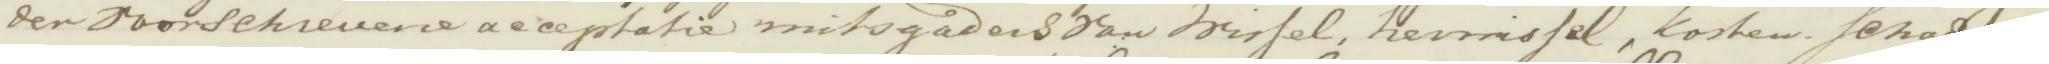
der Voorschrevene acceptatie mitsgaders Van Wissel, herwissel, kosten, schaden
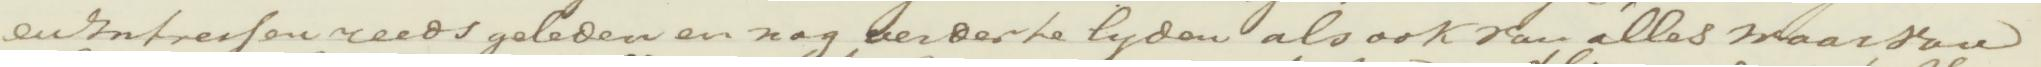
en Intressen reeds geleden en nog verder te lyden als ook van alles waarvan
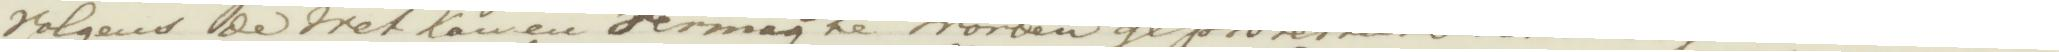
Volgens de Wet kan en Vermag te Worden geprotesteerd. Aldus gedaan te Haar
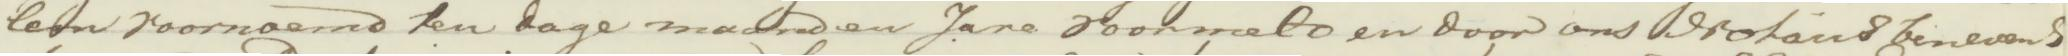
lem Voornoemd ten dage maanden Jare Voormeld en door ons Notaris benevens
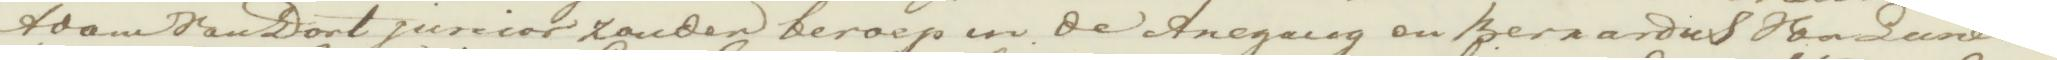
Adam Van Dort junior zouder beroep in de Anegang en Bernardus Van Lunen
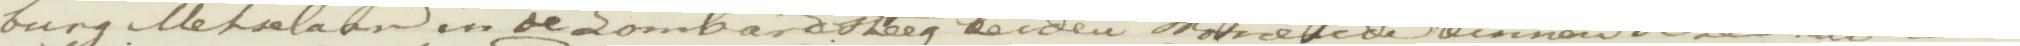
burg Metselaar in de Lombardsteeg beiden Wonende binnen deze stad als
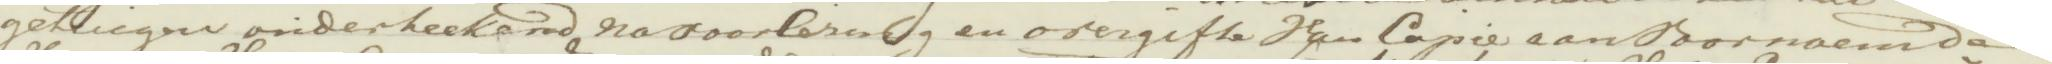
getuigen onderteekend na voorlezing en overgifte Van Copie aan Voornoemde
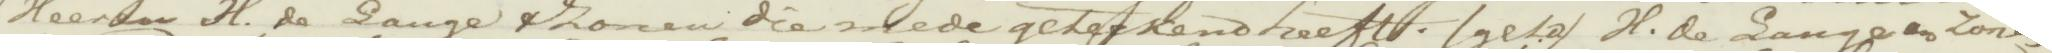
Heeren H. de Lange & zonen die mede geteekend heeft. (get:d) H. de Lange en Zonen
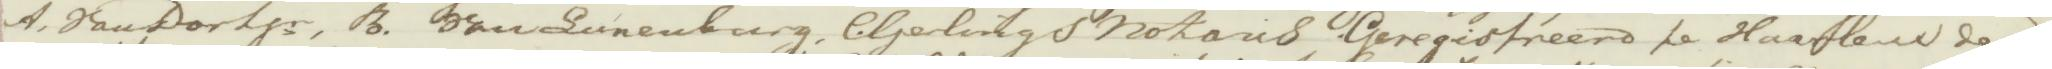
A. Van Dort j=r, B. Van Lunenburg, C. Gerlings Notaris Geregistreerd te Haarlem den
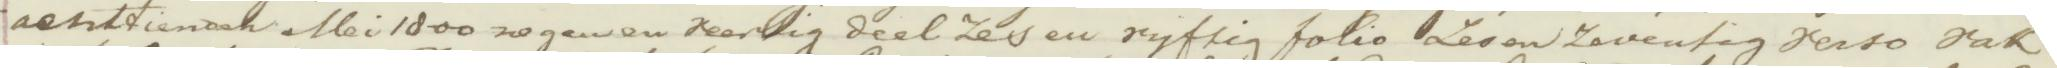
achttienden Mei 1800 negen en Veertig deel Zes en vijftig folio Zes en Zeventig Verso Vak
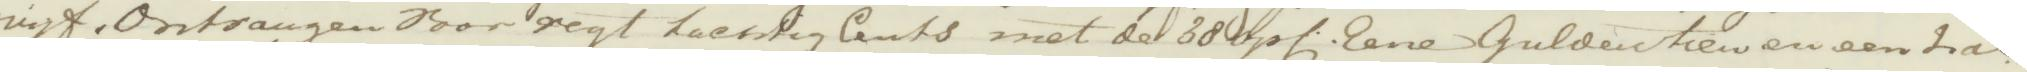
vijf. Ontvangen Voor regt tachtig Cents met de 38 opC: Eene Gulden tien en een hal,
